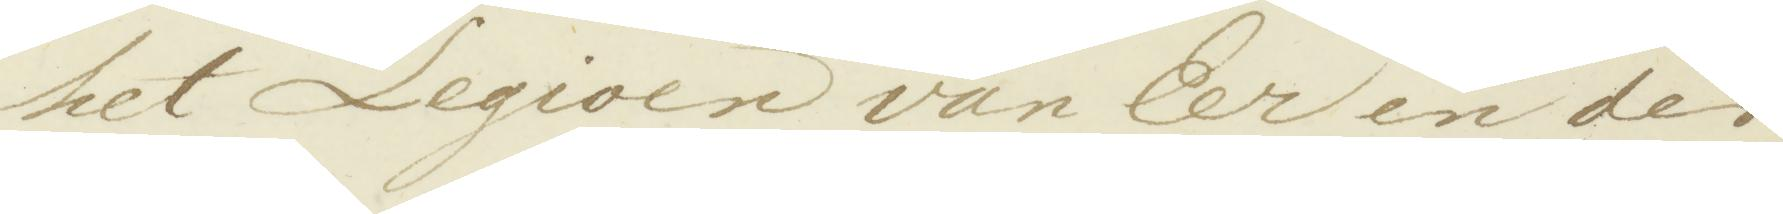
het Legioen van Eer en der
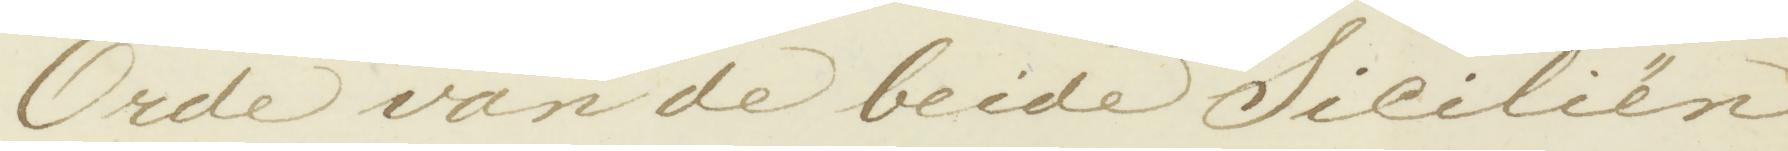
Orde van de beide siciliën,
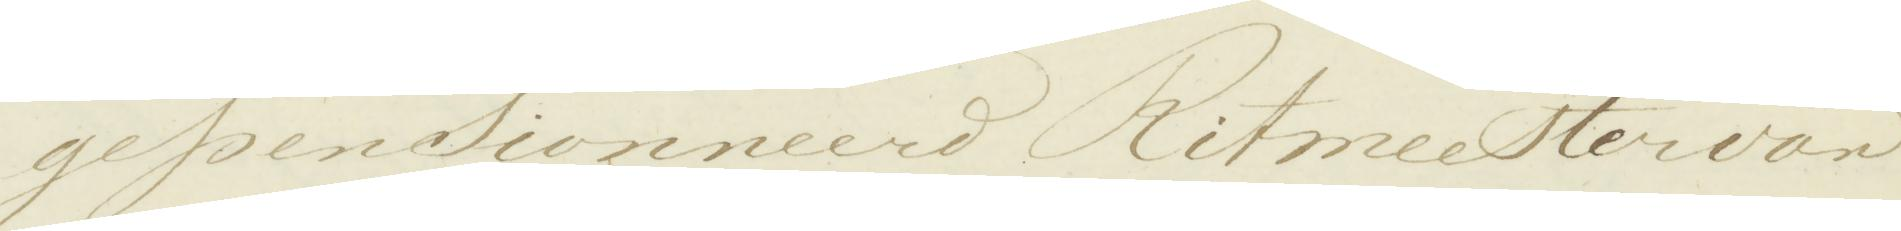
gepensionneerd Ritmeester van
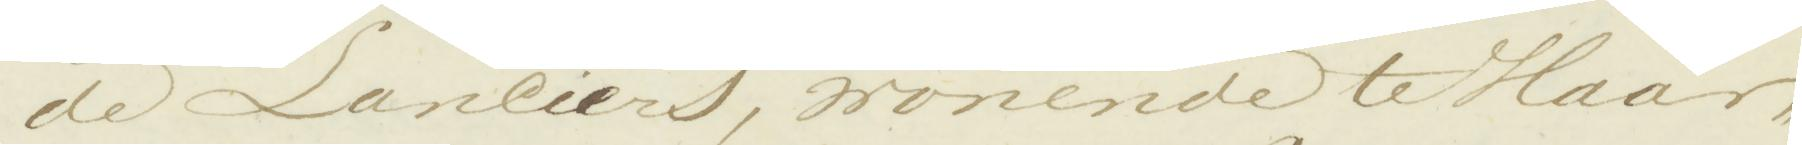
de Lanciers, wonende te Haar„
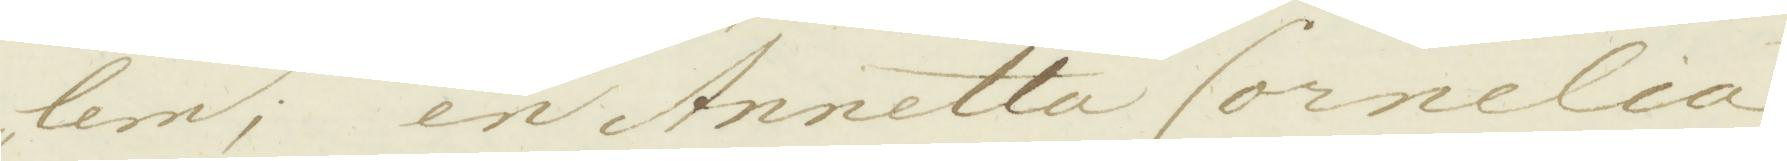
„lem; en Annetta Cornelia
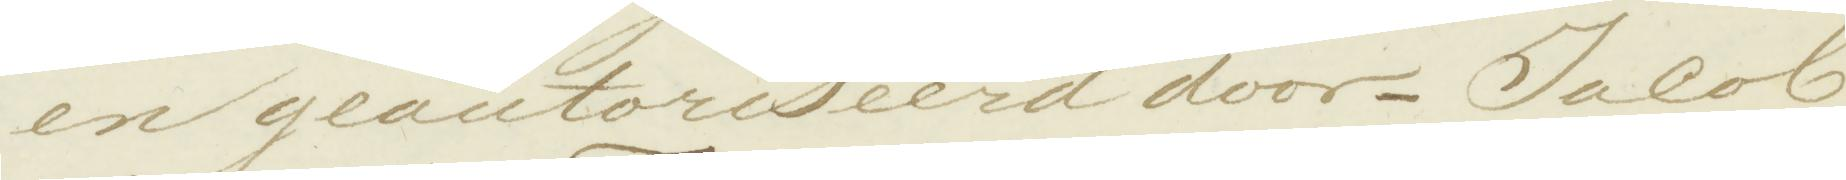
en geautoriseerd door- Jacob
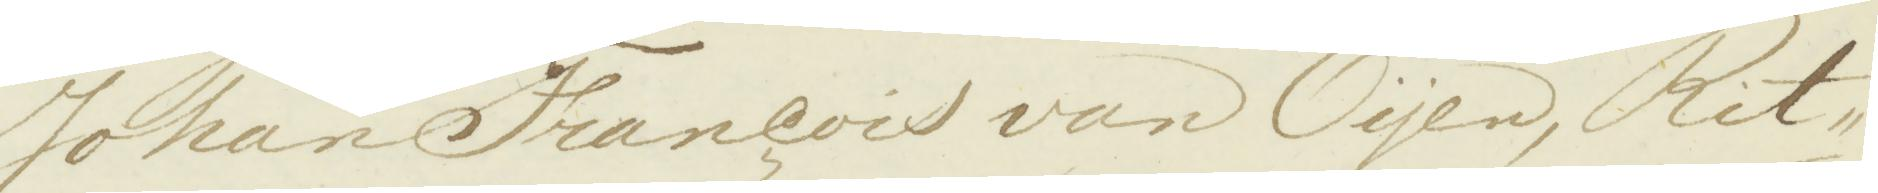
Johan François van Oijen, Rit„
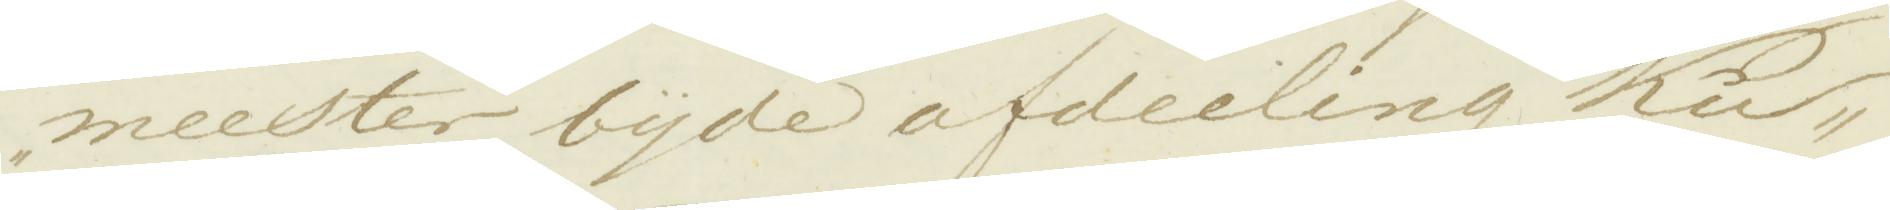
„meester bij de afdeeling Ku„
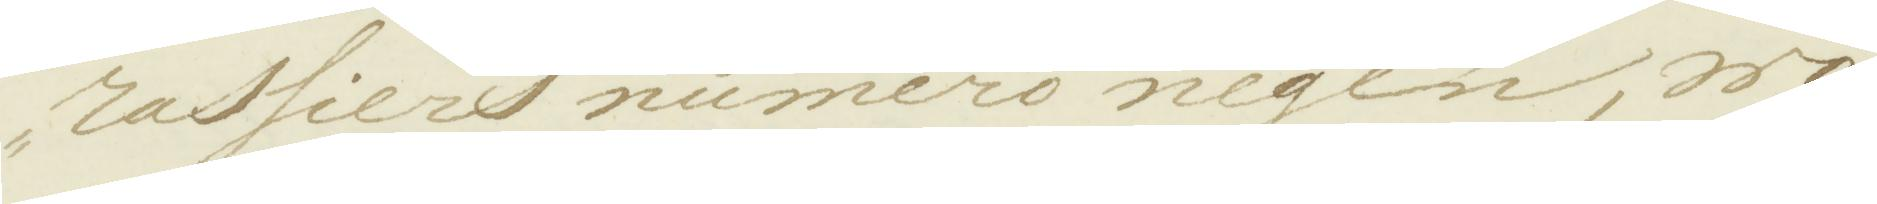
„rassiers numero negen, wo
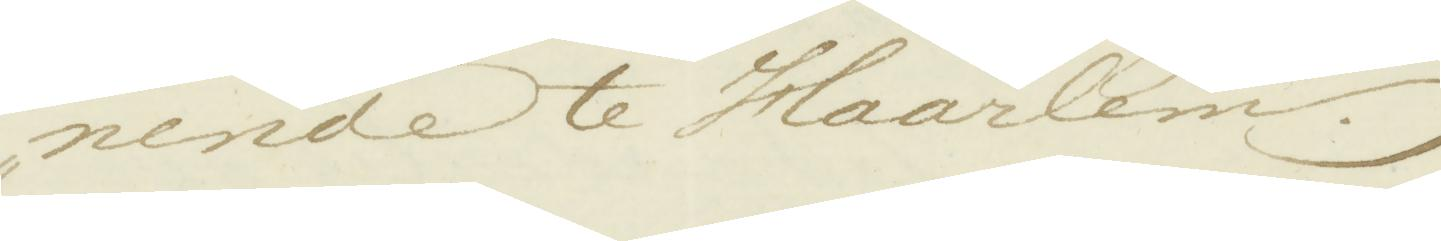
„nende te Haarlem.
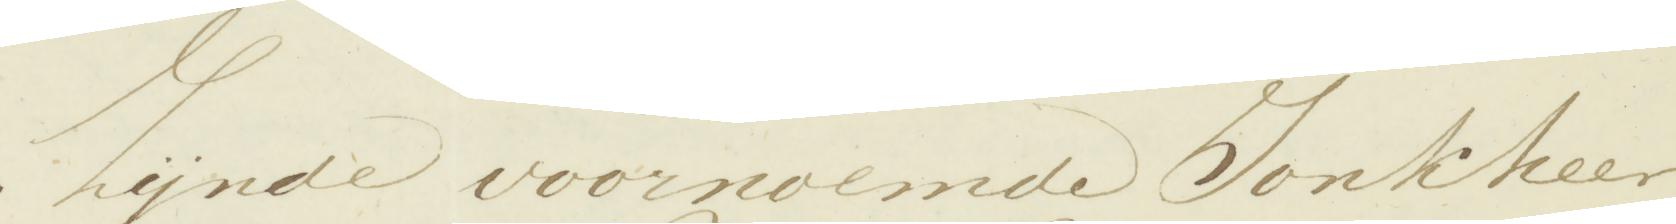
Zijnde voornoemde Jonkheer
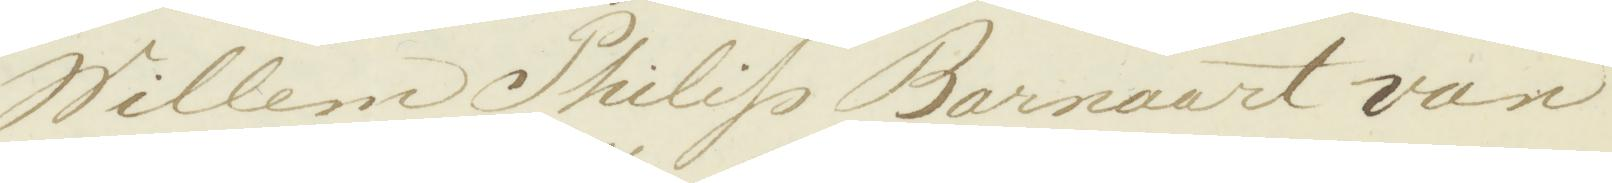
Willem Philip Barnaart van
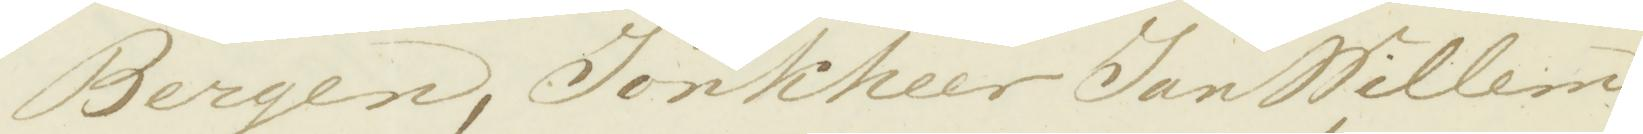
Bergen, Jonkheer Jan Willem
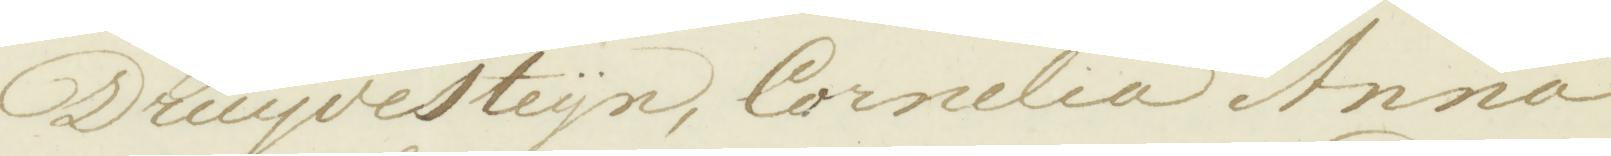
Druijvesteijn, Cornelia Anna
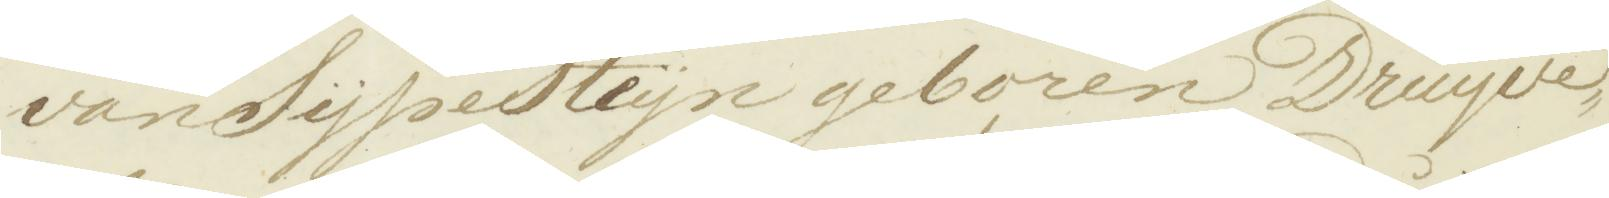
van Sijpesteijn geboren Druijve„
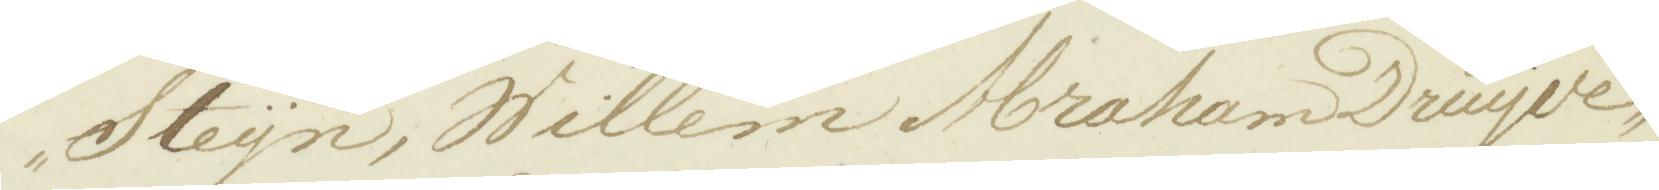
„steijn, Willem Abraham Druijve„
